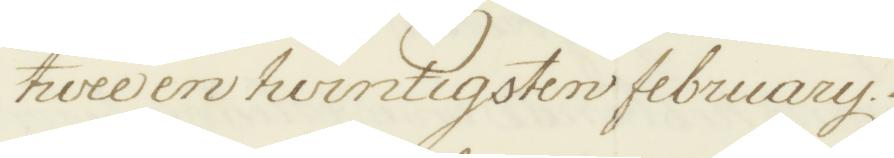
twee en twintigsten february.
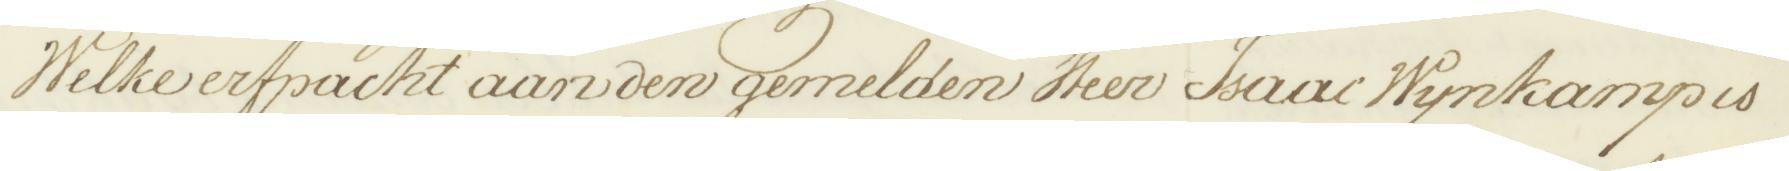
Welke erfpacht aan den gemelden Heer Isaac Wynkamp is
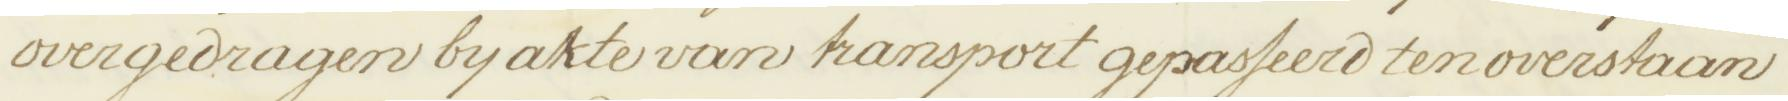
overgedragen by akte van transport gepasseerd ten overstaan
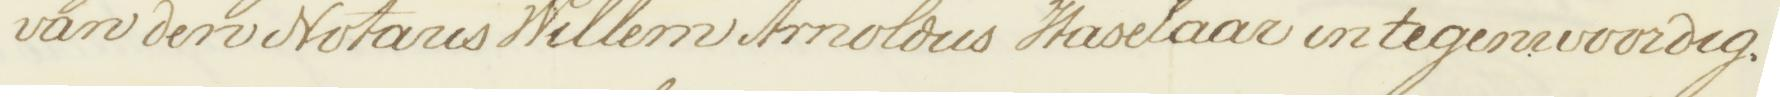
van den Notaris Willem Arnoldus Haselaar in tegenwoordig.
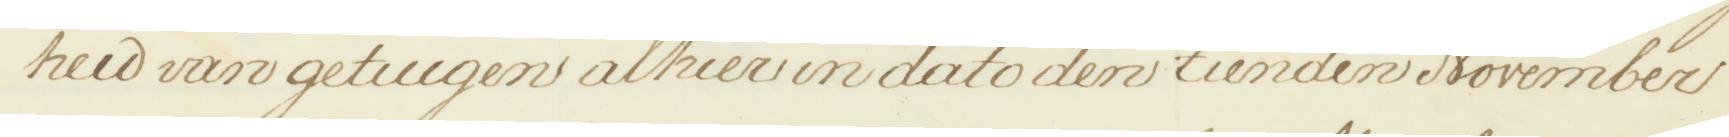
heid van getuigen alhier in dato den tienden November
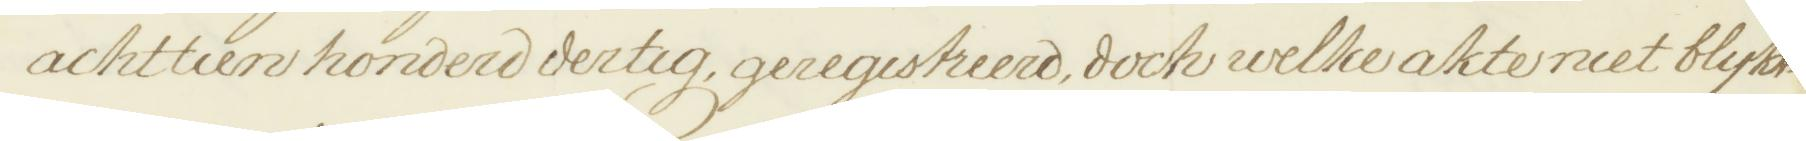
achttien honderd dertig, geregistreerd, doch welke akte niet blykt
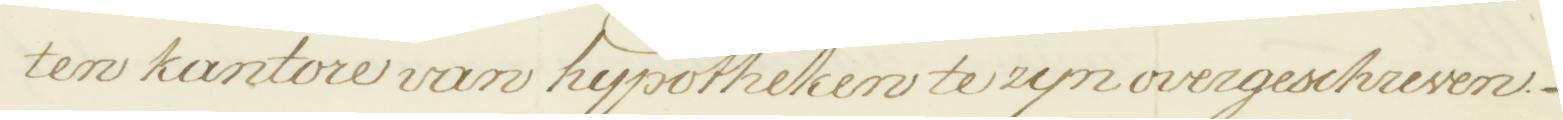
ten kantore van hypotheken te zyn overgeschreven.
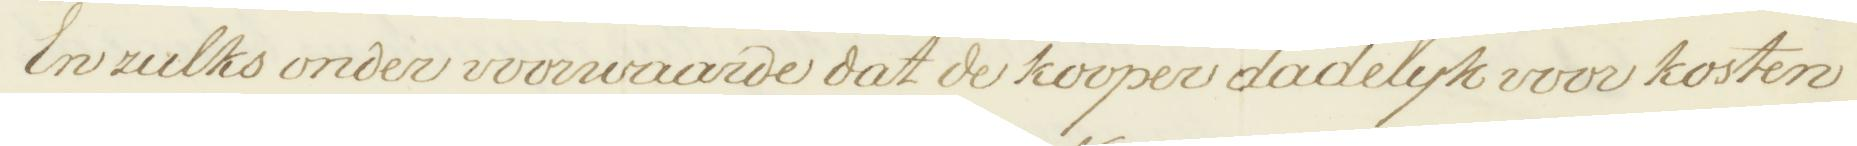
En zulks onder voorwaarde dat de kooper dadelyk voor kosten
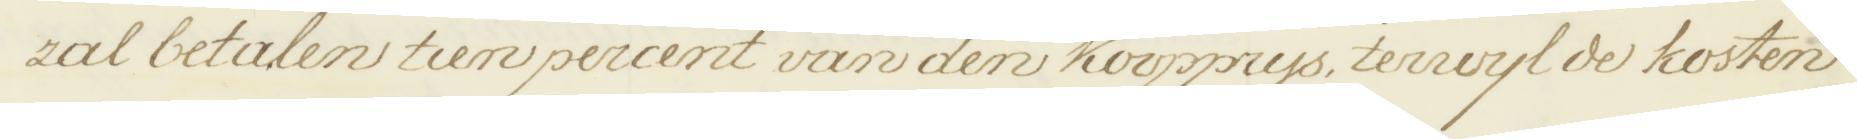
zal betalen tien percent van den koopprys, terwyl de kosten
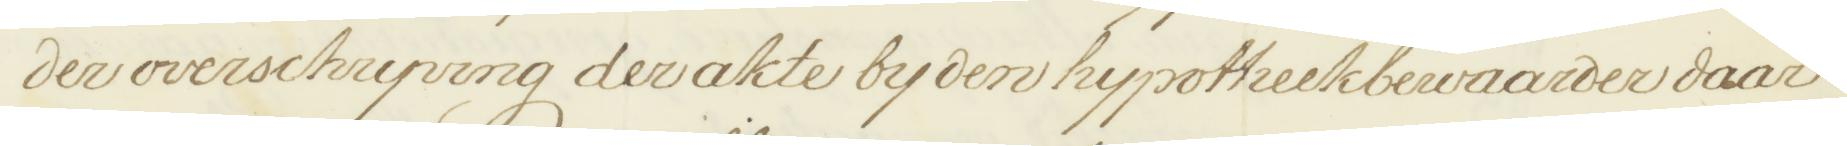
der overschryving der akte by den hypotheekbewaarder daar
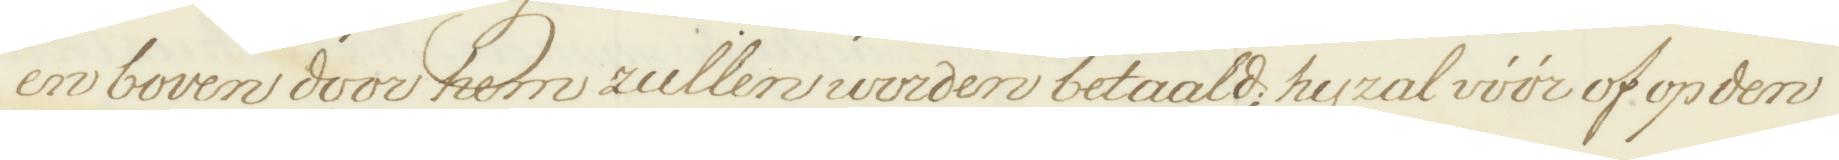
en boven door hem zullen worden betaald; hy zal vóór of op den
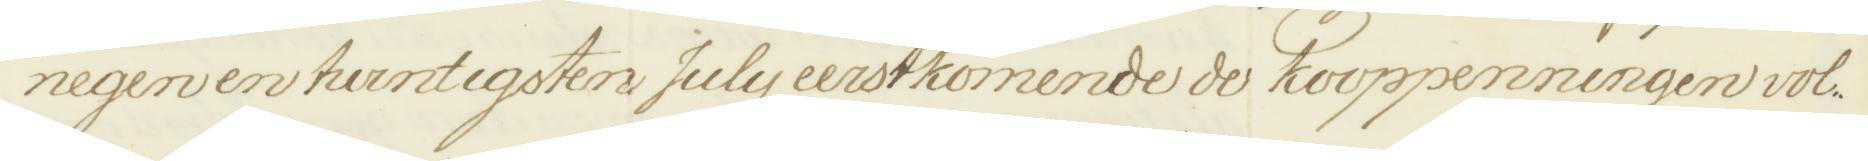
negen en twintigsten July eerstkomende de kooppenningen vol„
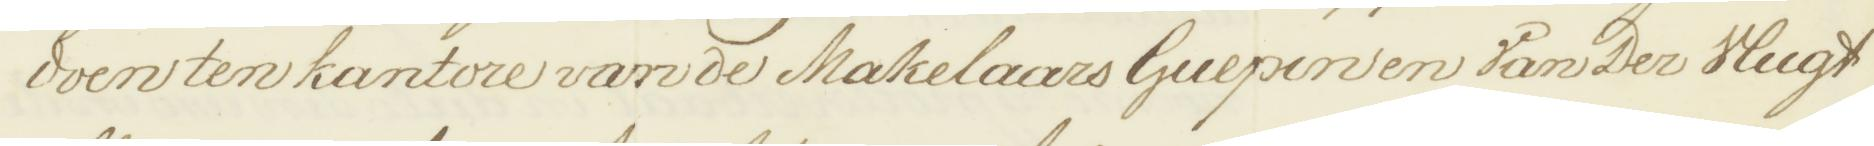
doen ten kantore van de Makelaars Guepin en Van Der Vlugt
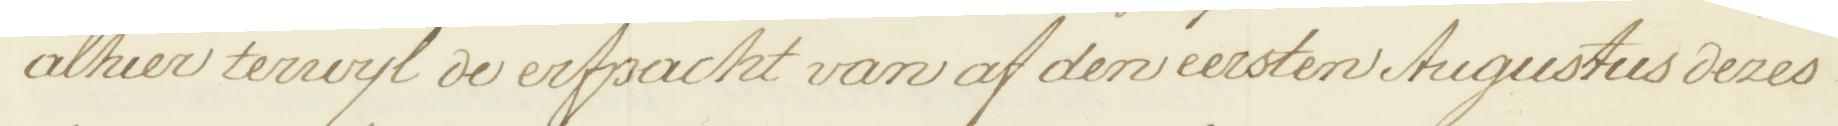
alhier terwyl de erfpacht van af den eersten Augustus dezes
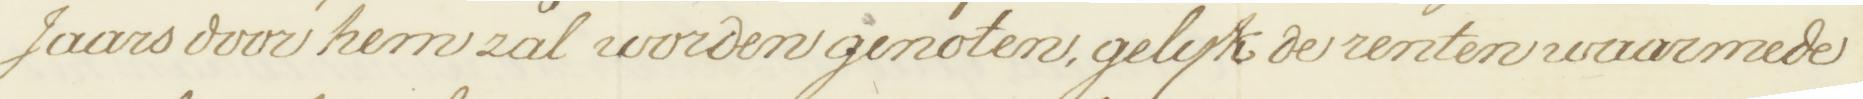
Jaars door hem zal worden genoten, gelyk de renten waarmede
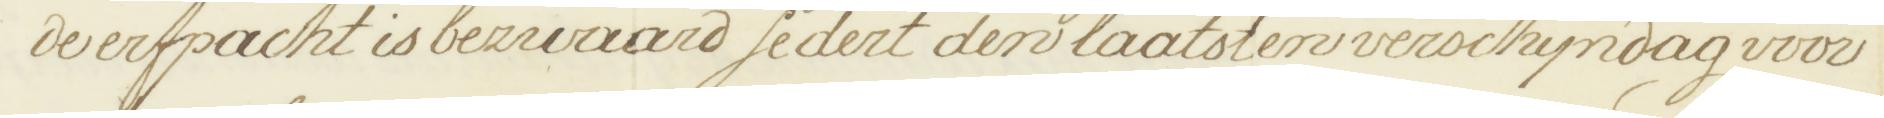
de erfpacht is bezwaard sedert den laatsten verschyndag voor
